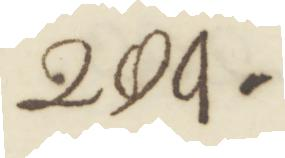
284.
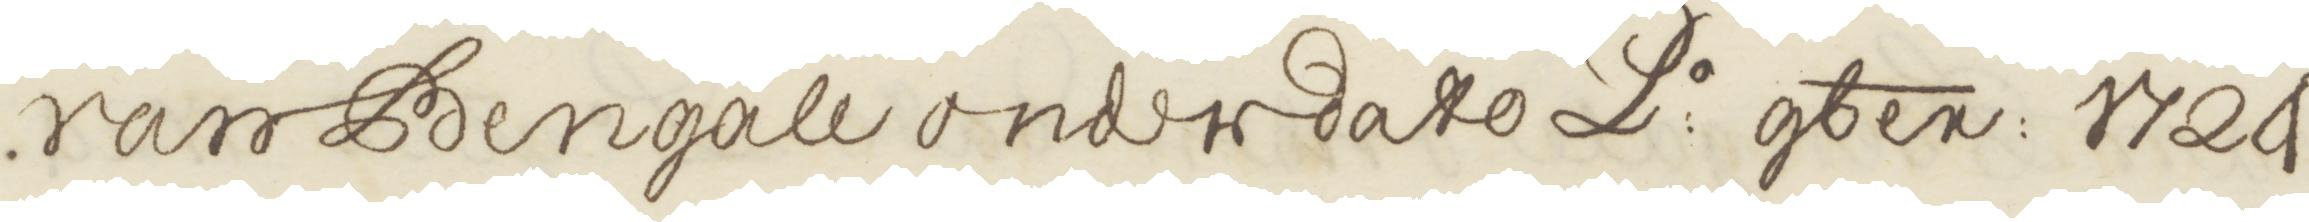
van Bengale onder dato P:o 9ber: 1724
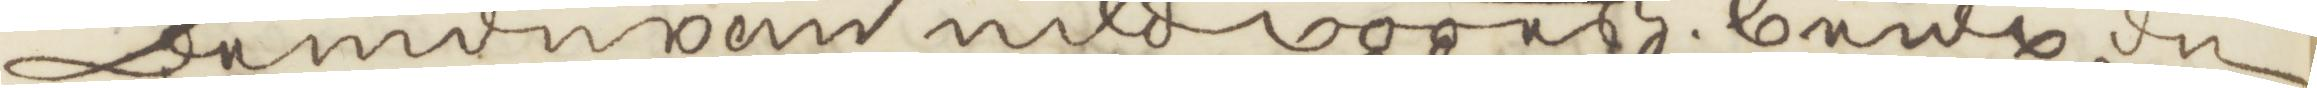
Termen van uEd voors. briev en
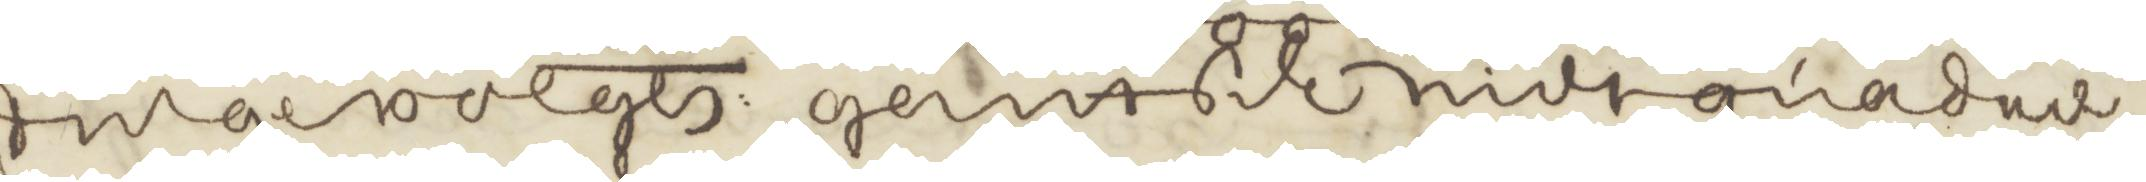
die gevolglijk gantsch niet quadre
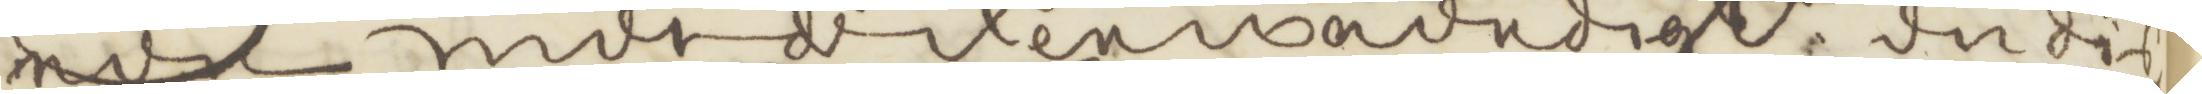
ren met de Eerwaerdigh.t en dis
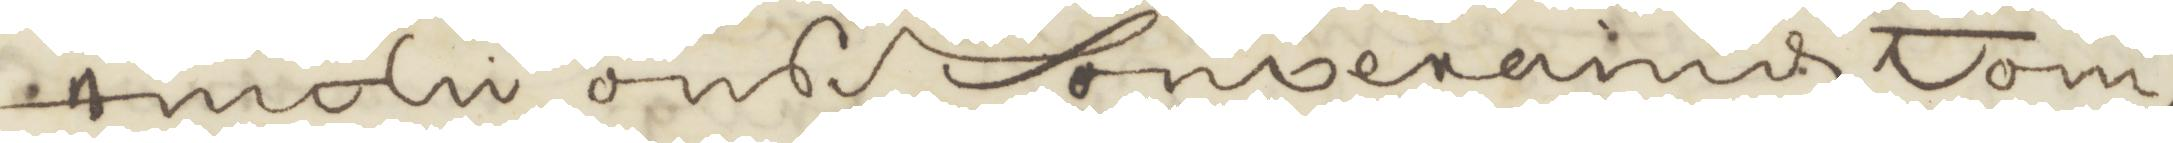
tinctie onse souverainen Com
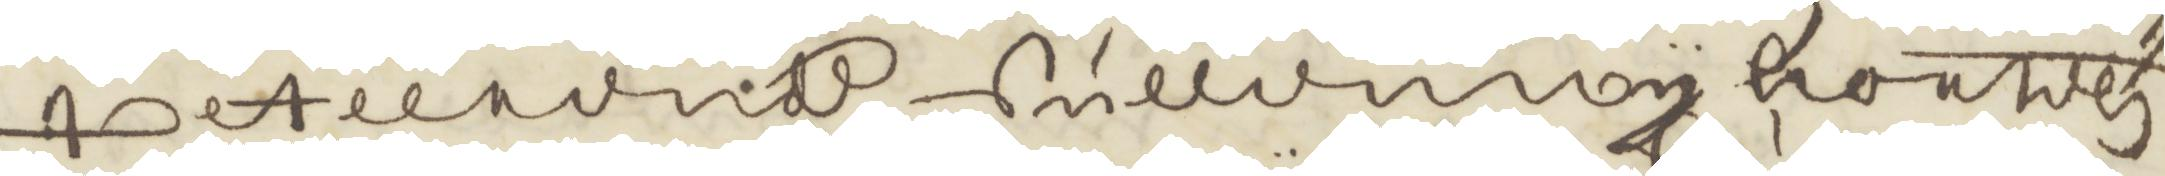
peteerende sullen wij kortelijk
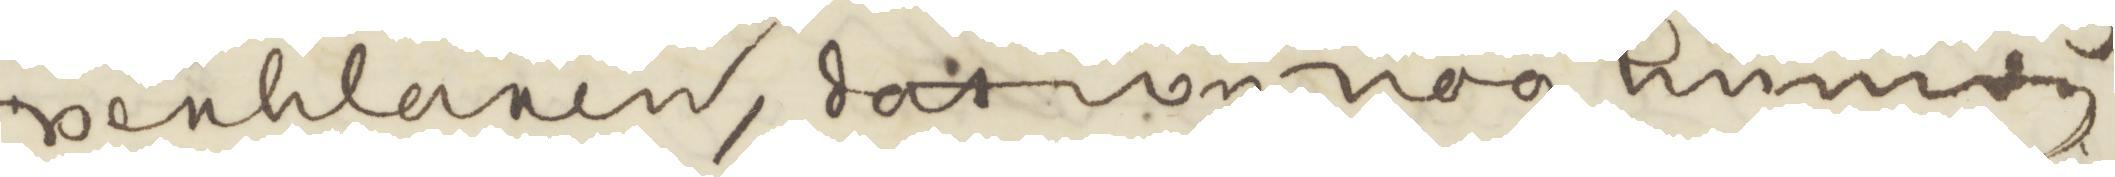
verklaren, dat wij nog kunnen
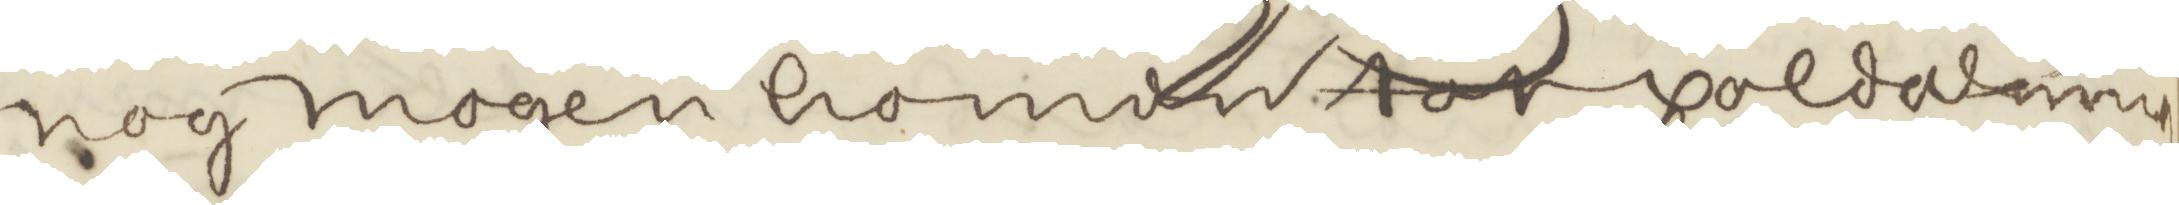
nog mogen komen tot voldoening
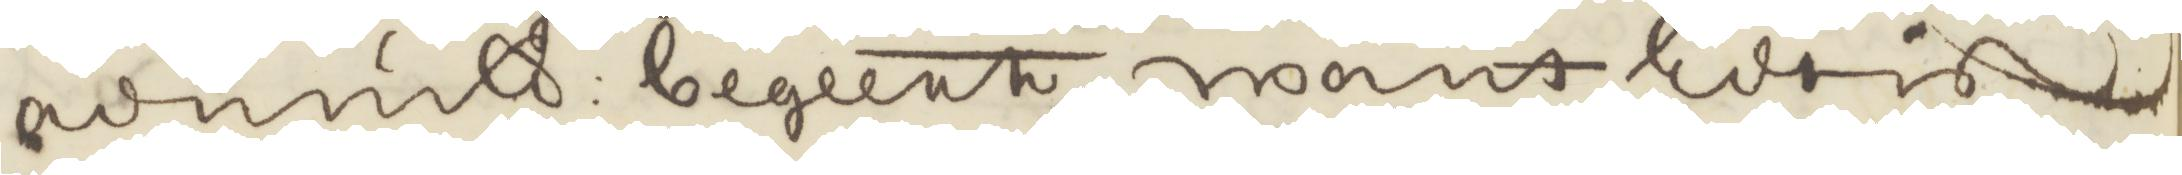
aen uEd: begeerte, want het is
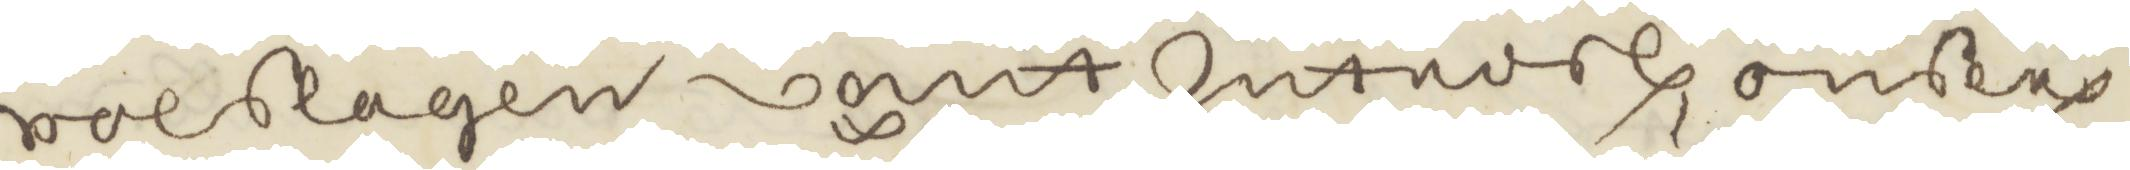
volslagen van 't Jntrest onser
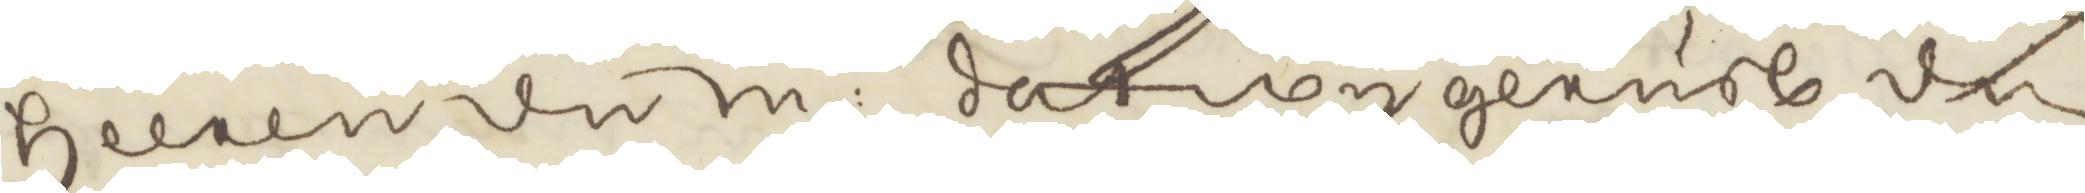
heeren en m:' dat wij gerust en
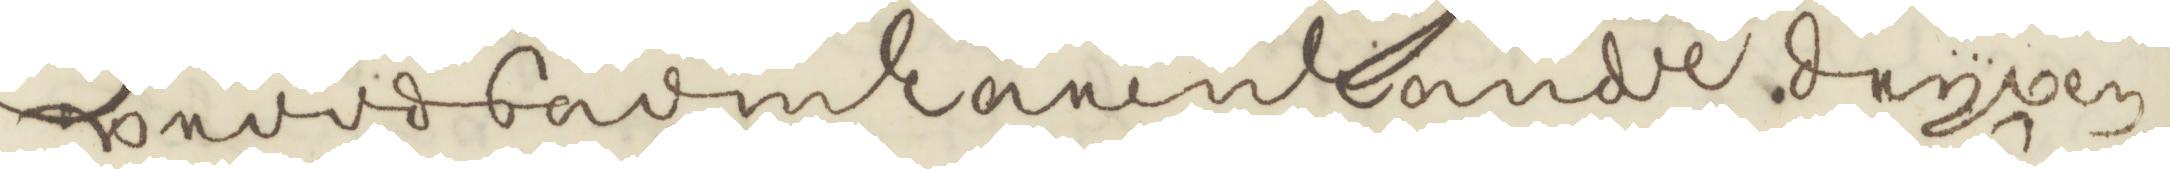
vreedsaem haren handel drijven
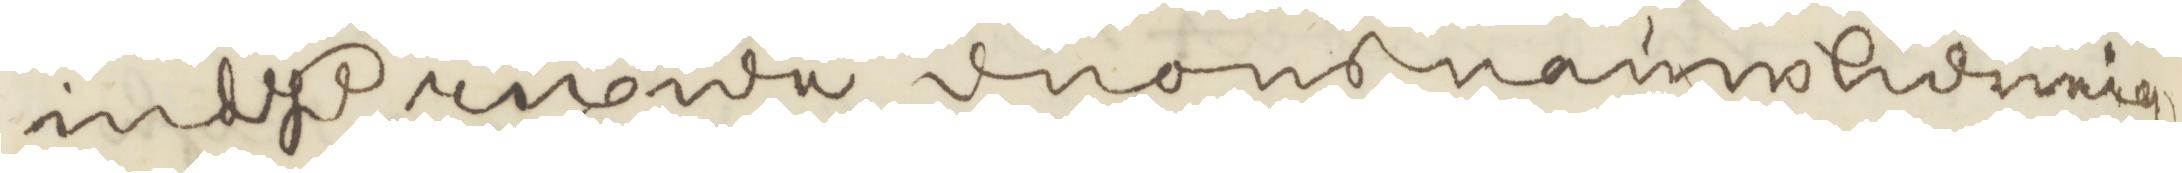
in dese rivier en ons nauwkeurig
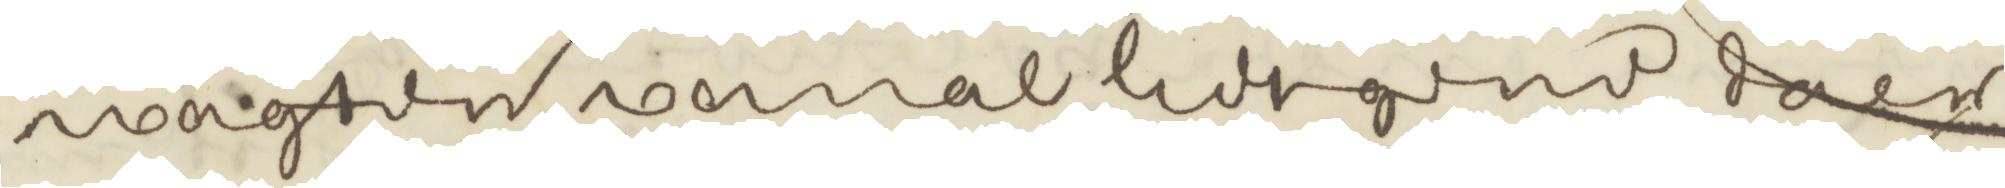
wagten van al hetgene daer
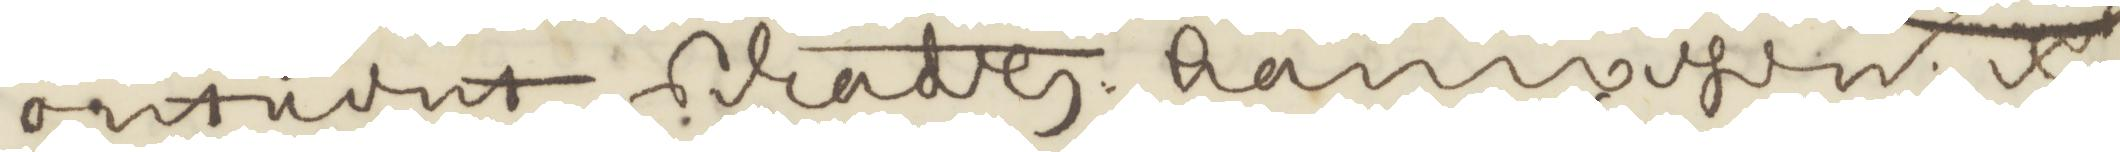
ontrent schadelijk kan wesen. En
